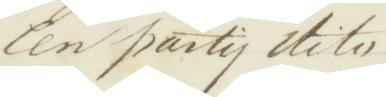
Een partij dito
